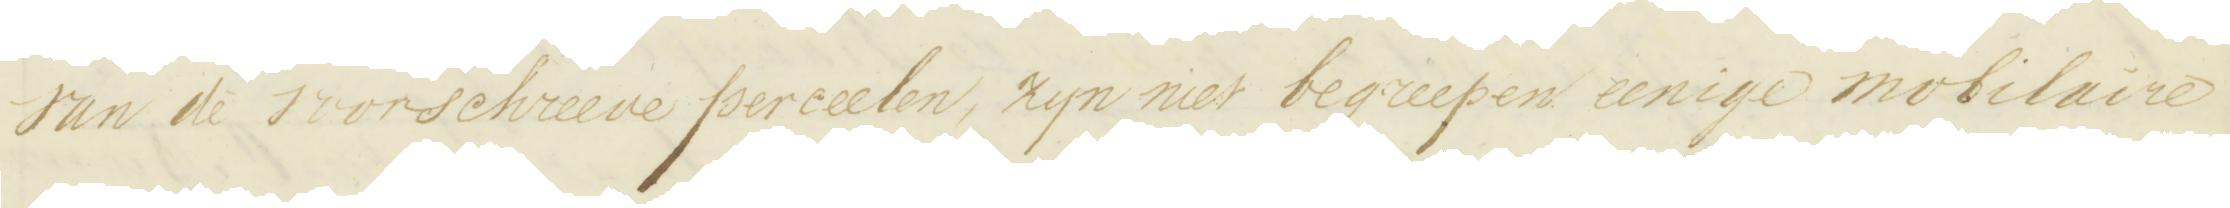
van de voorschreeve perceelen, zyn niet begreepen eenige mobilaire
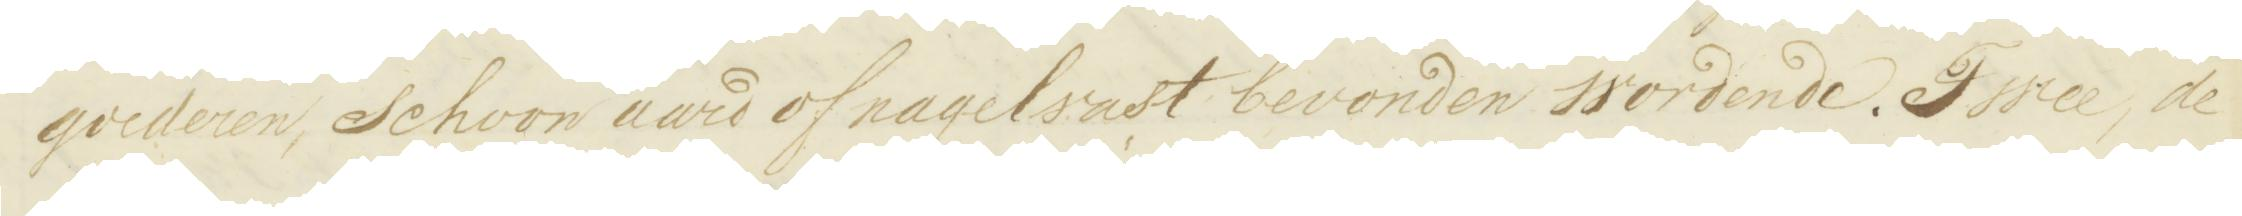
goederen, schoon aard of nagelvast bevonden wordende. Twee, de
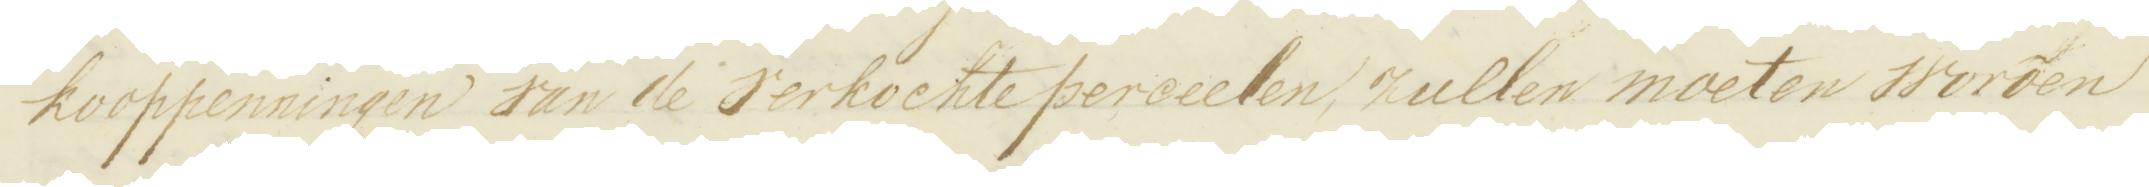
kooppenningen van de Verkochte perceelen, zullen moeten worden
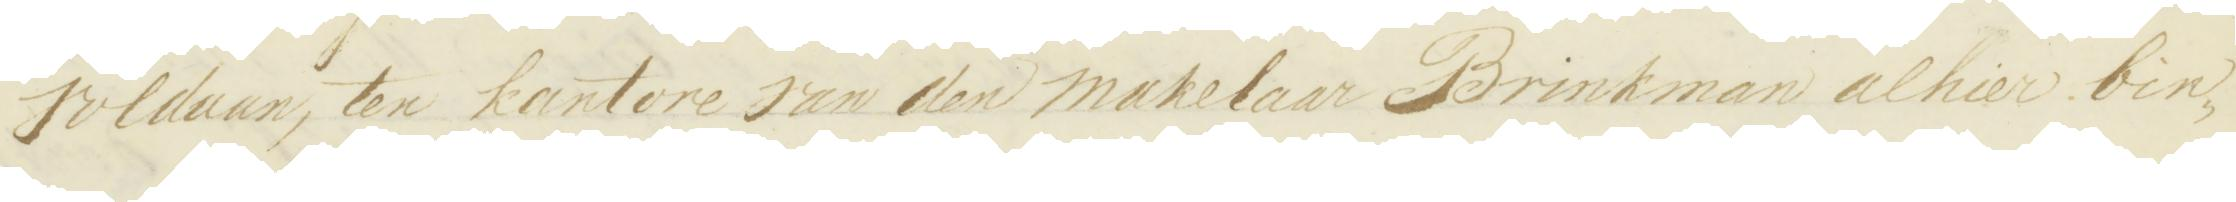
voldaan, ten kantore van den makelaar Brinkman alhier bin„
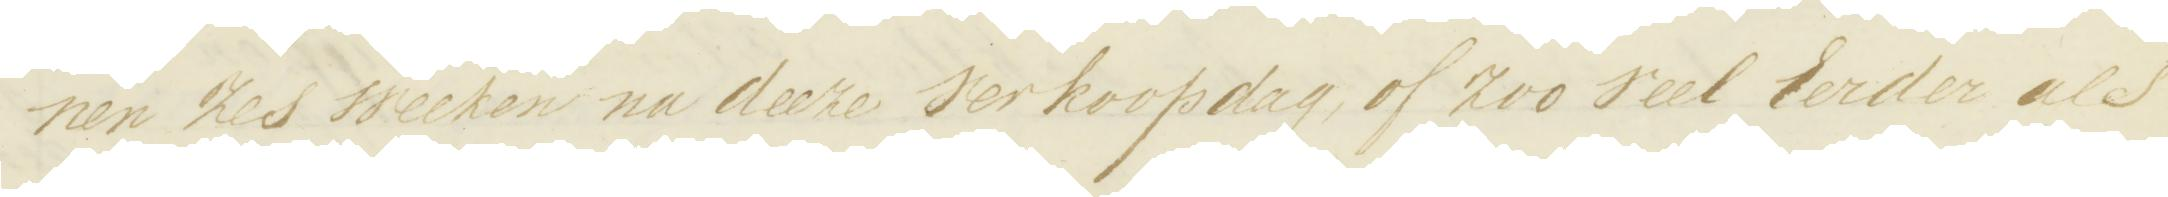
nen zes weeken na deeze verkoopdag, of zoo veel Eerder als
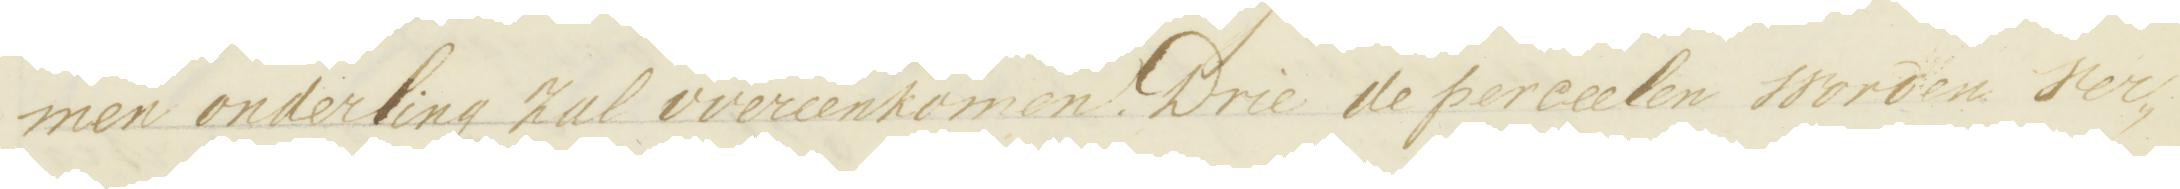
men onderling zal overeenkomen. Drie de perceelen worden ver„
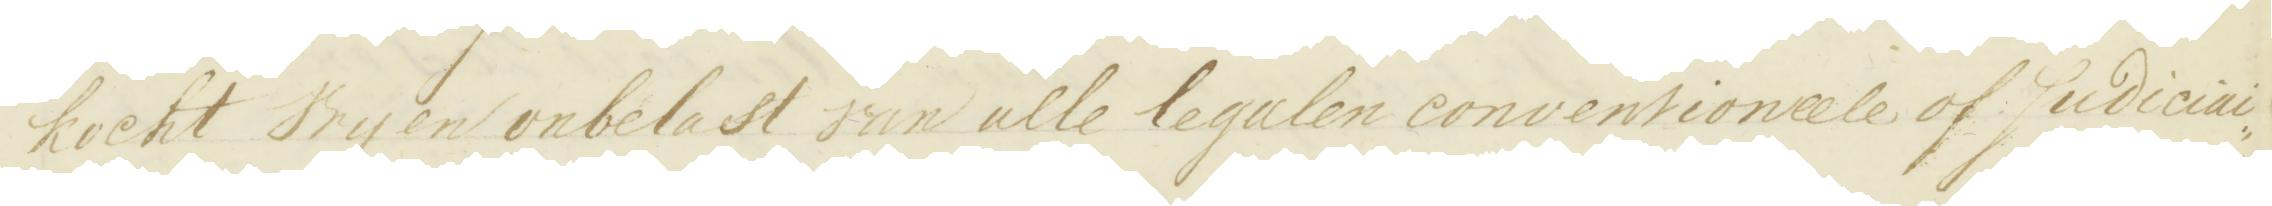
kocht Vry en onbelast van alle legalen conventioneele of Judiciai„
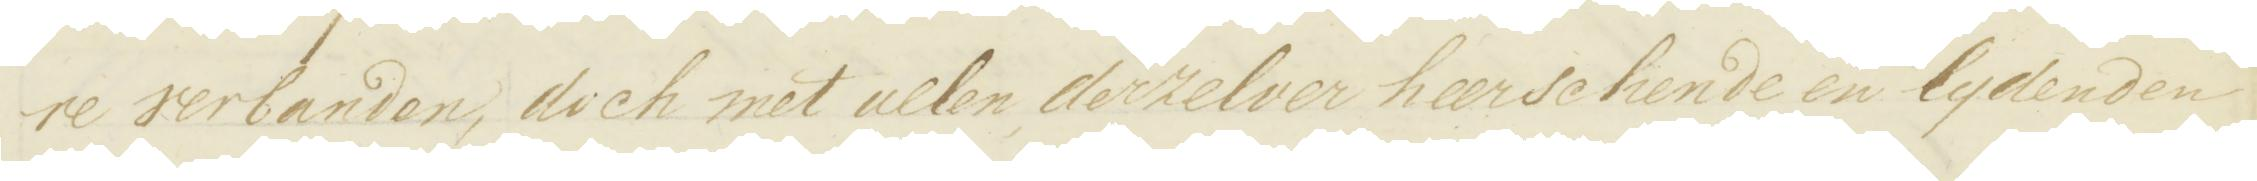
re verbanden, doch met allen, derzelver heerschende en lydenden
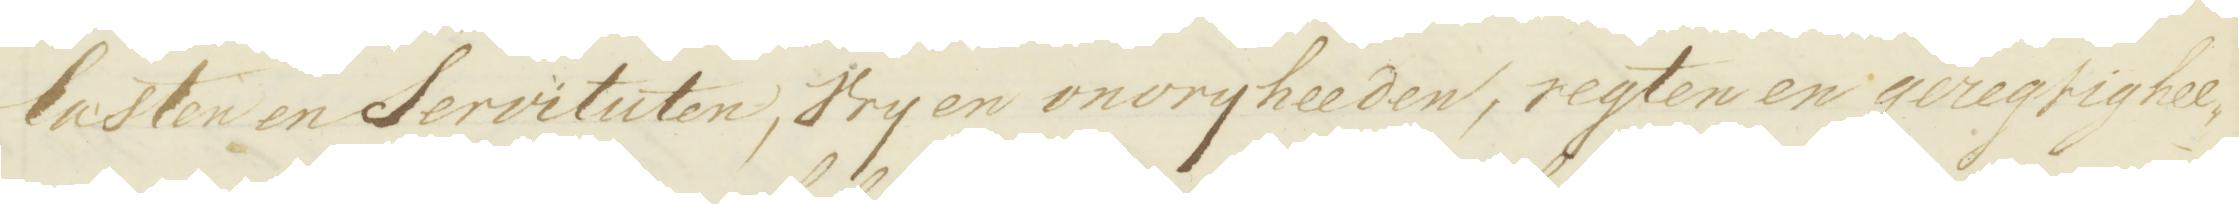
lasten en Servituten, Vry en onvryheeden, regten en geregtighee„
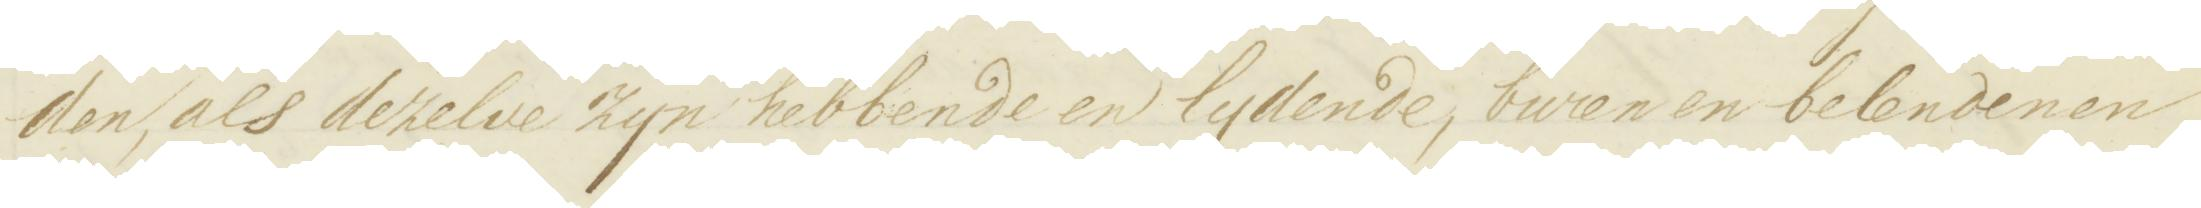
den, als dezelve zyn hebbende en lydende, buren en belenden en
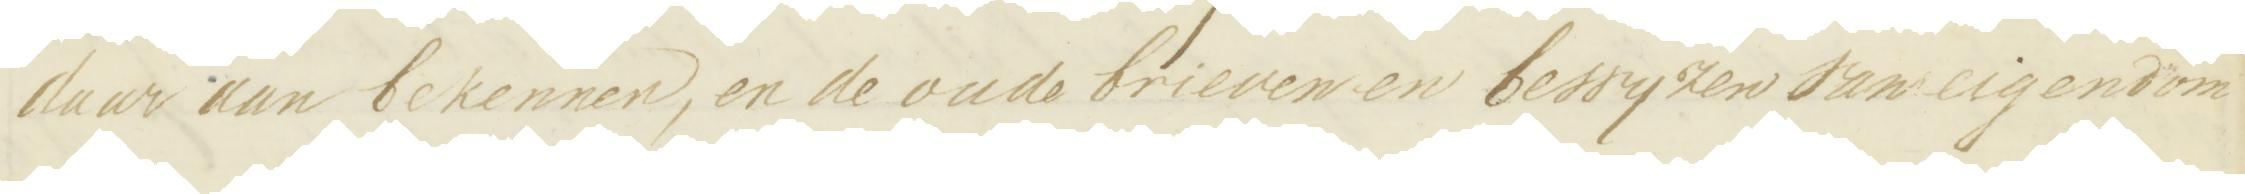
daar aan bekennen, en de oude brieven en bewyzen van eigendom
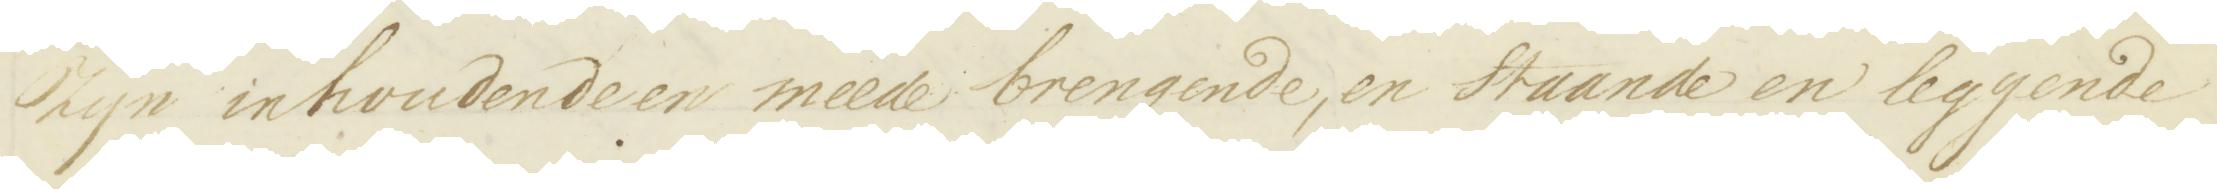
zyn inhoudende en meede brengende, en staande en leggende
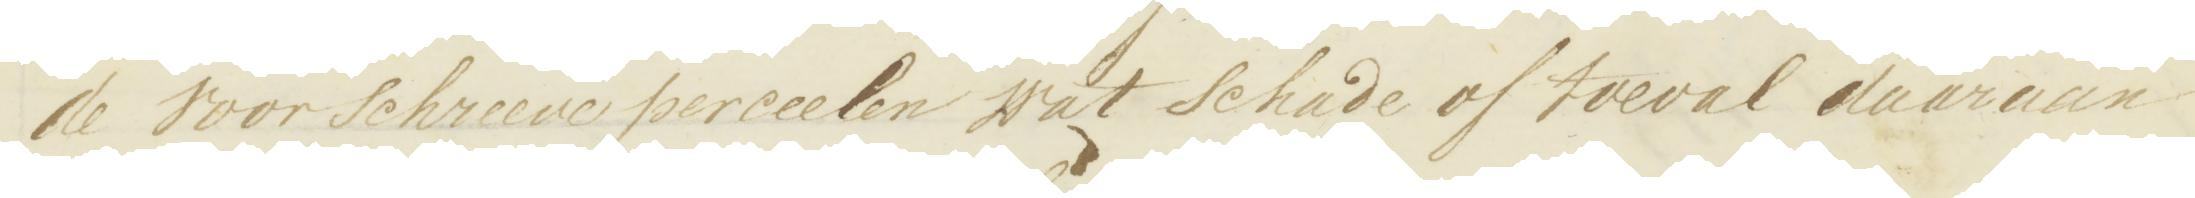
de voorschreeve perceelen wat schade of toeval daaraan
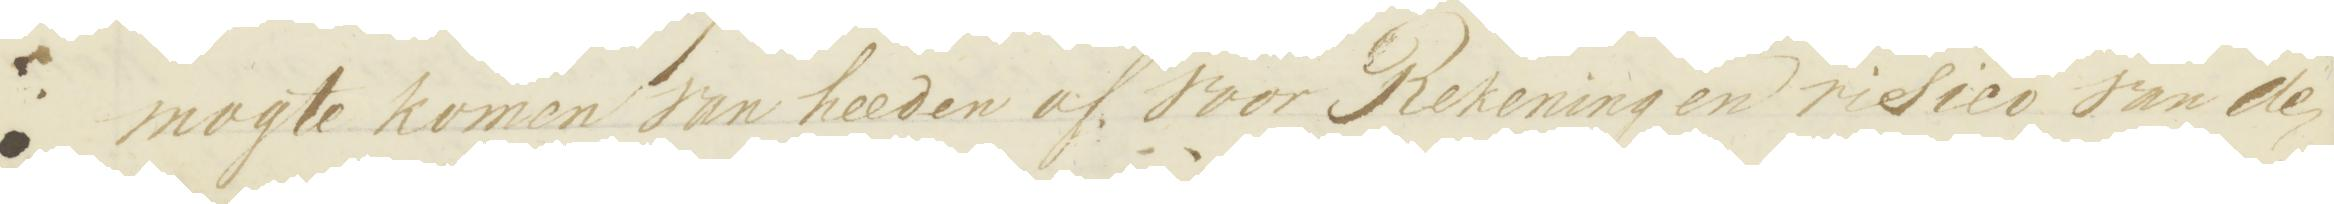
mogte komen van heeden of Voor Rekening en risico van de
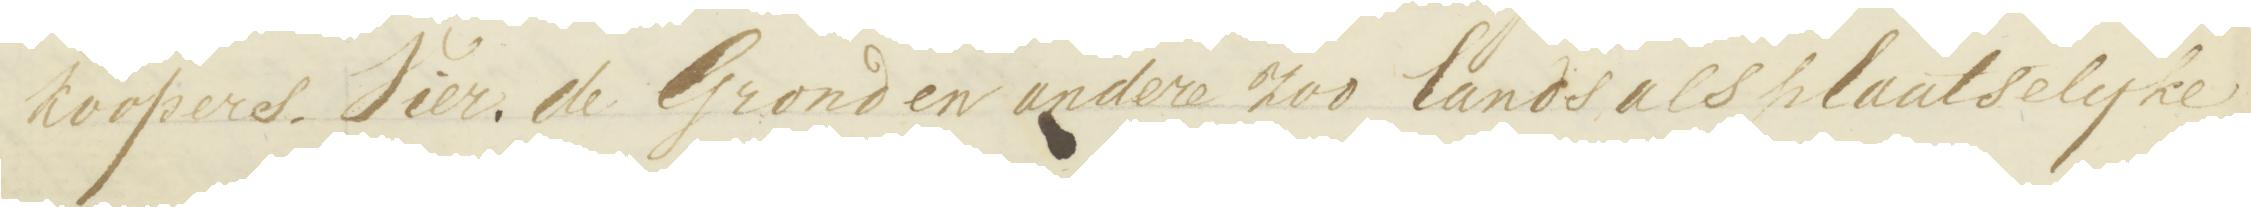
koopers. Vier. de Grond en andere zoo lands als plaatselyke
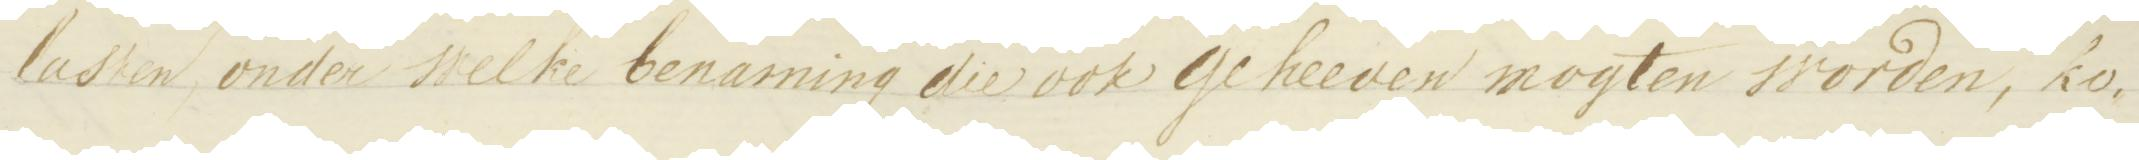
lasten onder welke benaming die ook geheeven mogten worden, ko„
